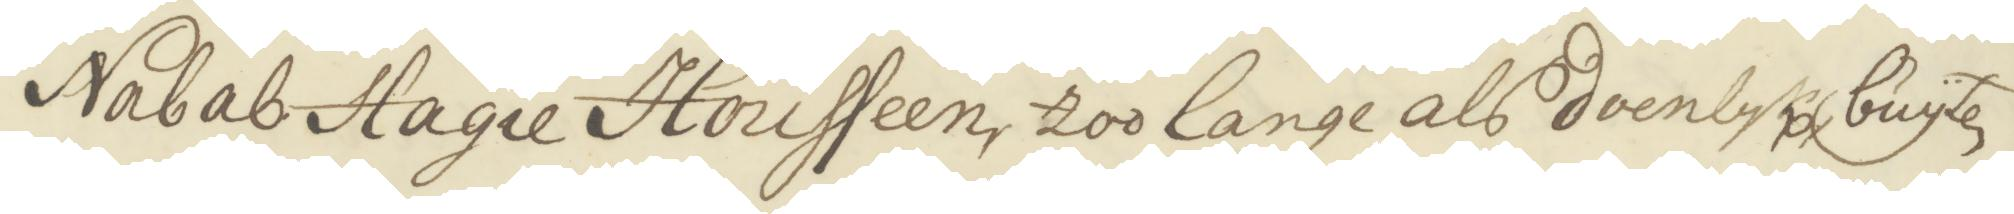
Nabab Hagie Housseen, zoo lange als doenlyk, buijten
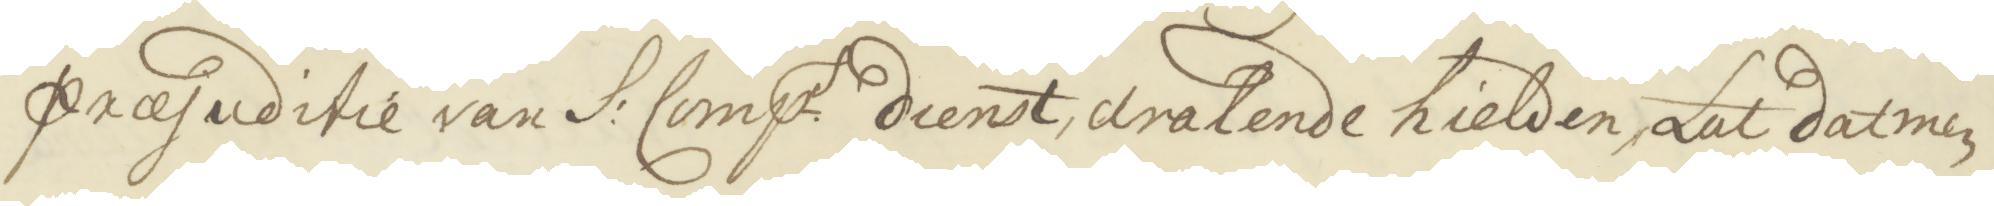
præjuditie van S: Comp:s dienst, dralende hielden, tot dat men
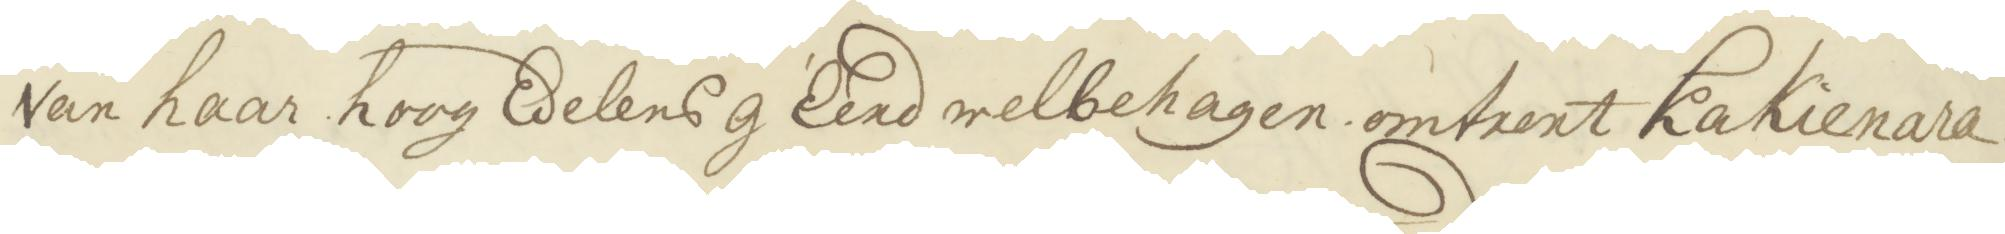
van haar hoog Edelens g’ Eerd welbehagen omtrent Kakienara
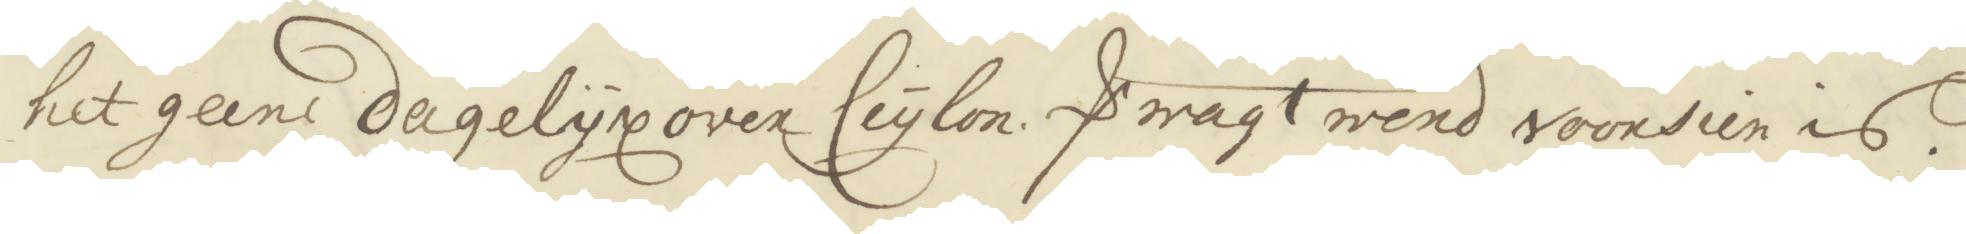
het geene dagelijx over Ceijlon verwagt werd voorsien is.
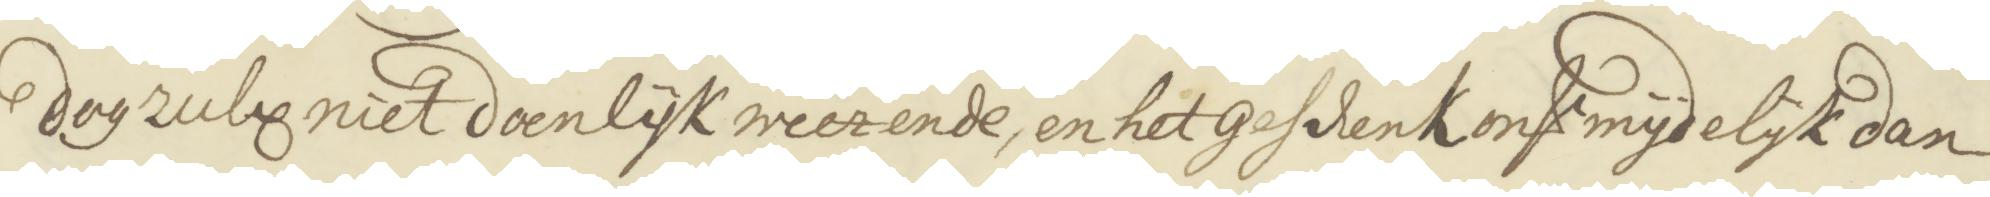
dog zulx niet doenlijk weezende, en het geschenk onvermijdelijk dan
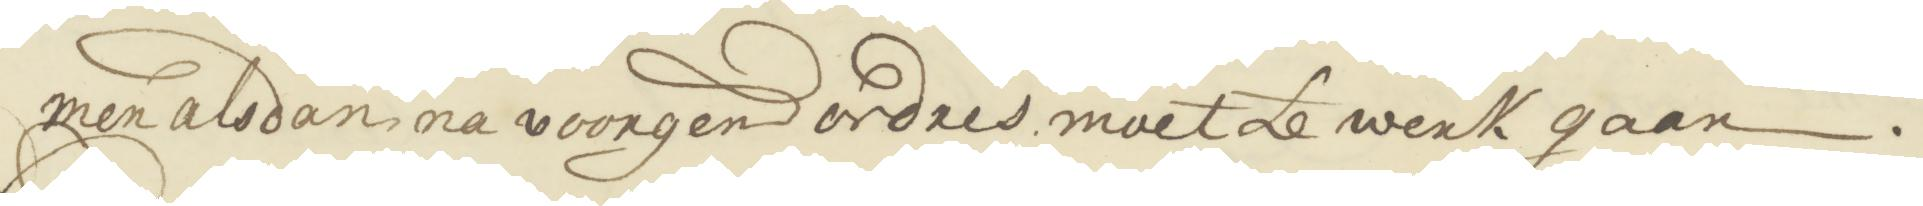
men als dan na voorgen:e ordres moet te werk gaan.
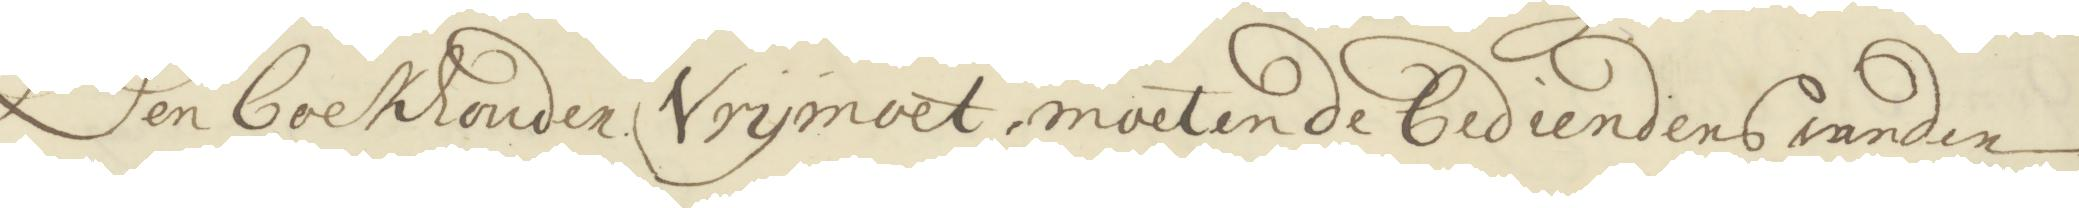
Den boekhouder Vrijmoet, moeten de bedienders vanden
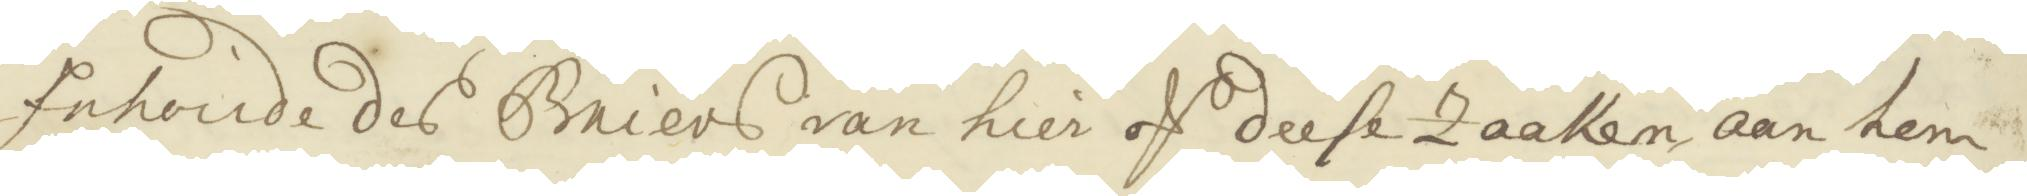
Jnhoude des Brievs van hier over deese Zaaken aan hem
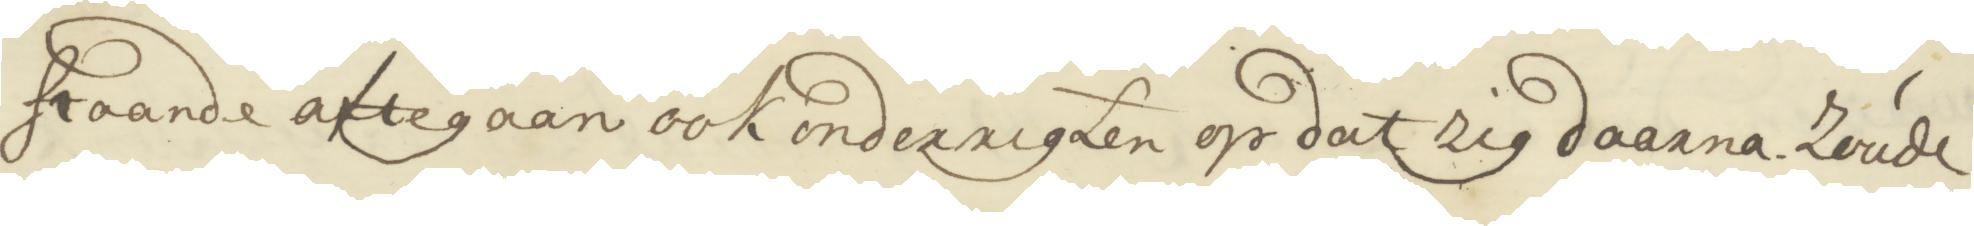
staande aftegaan ook onderrigten op dat zig daarna. Zoude
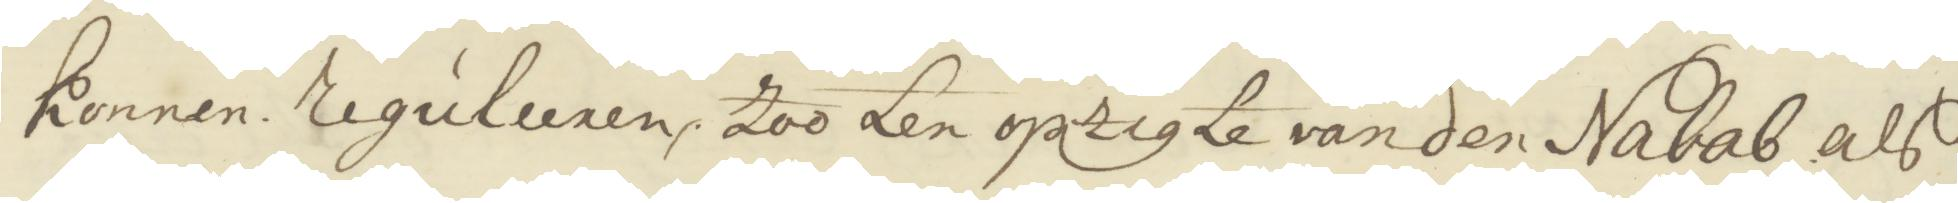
konnen. reguleeren, Zoo ten opzigte van den Nabab als
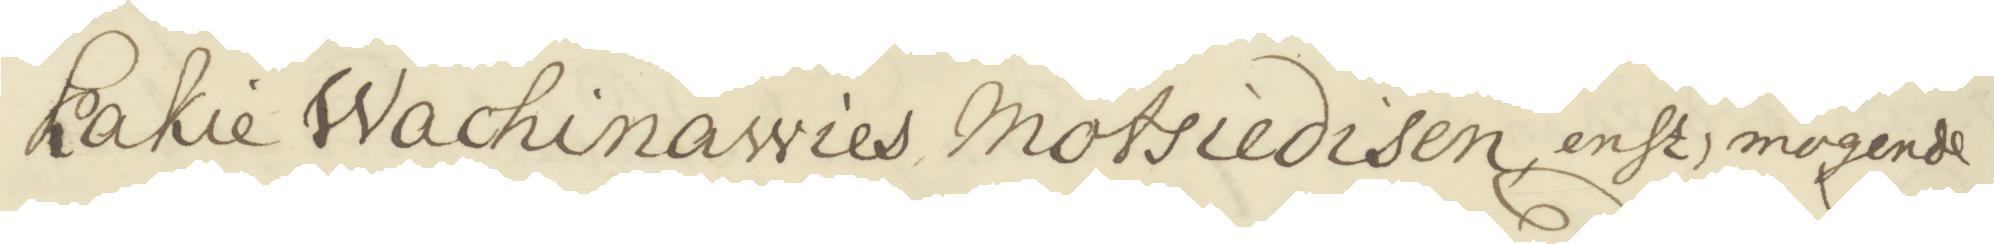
Kakie Wachinawies Motsiedisen, ensz: mogende
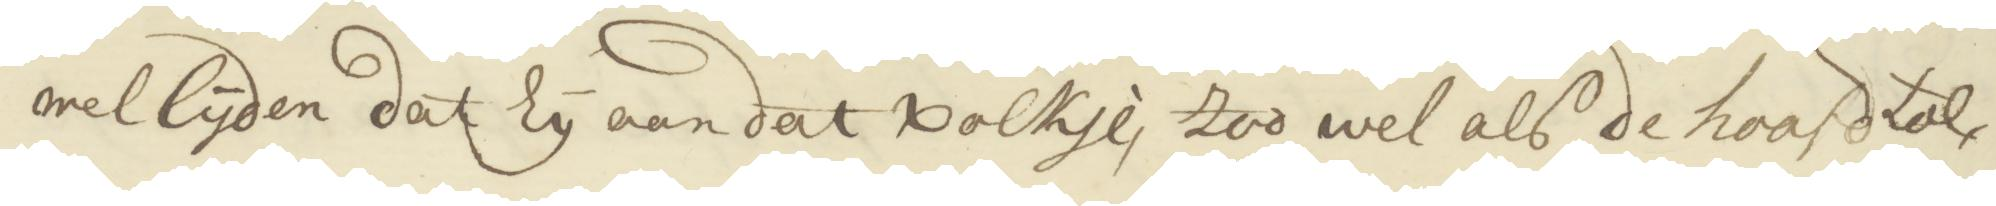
wel lijden dat hij aan dat volkje, zoo wel als de hoofd tol,
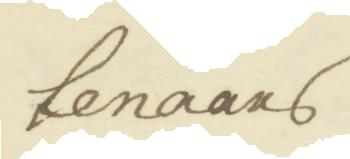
lenaars
